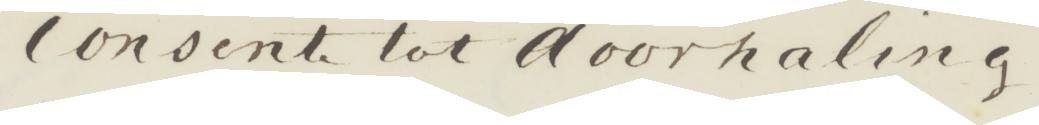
consent tot doorhaling
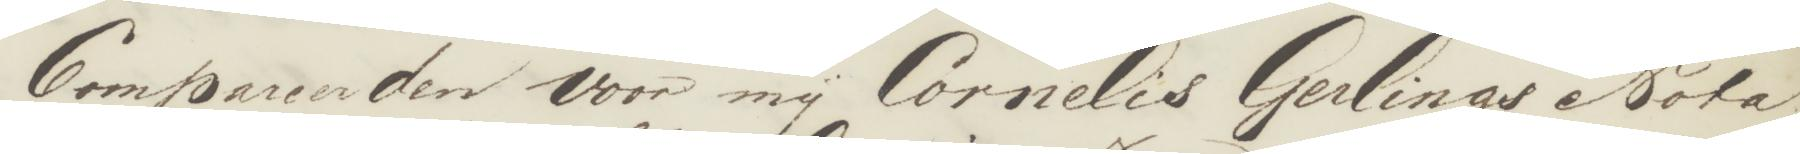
Compareerden voor mij Cornelis Gerlings Nota
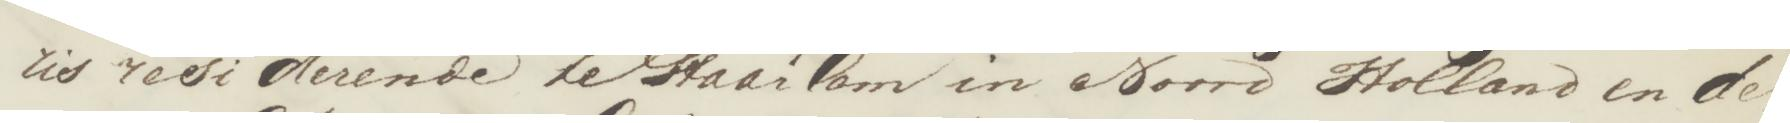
ris residerende te Haarlem in Noord Holland en de
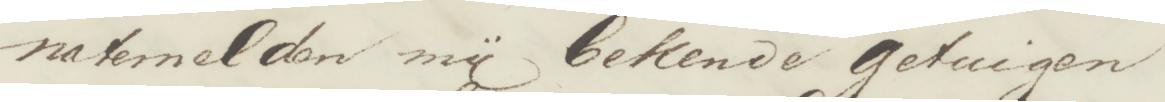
natemelden mij bekende getuigen
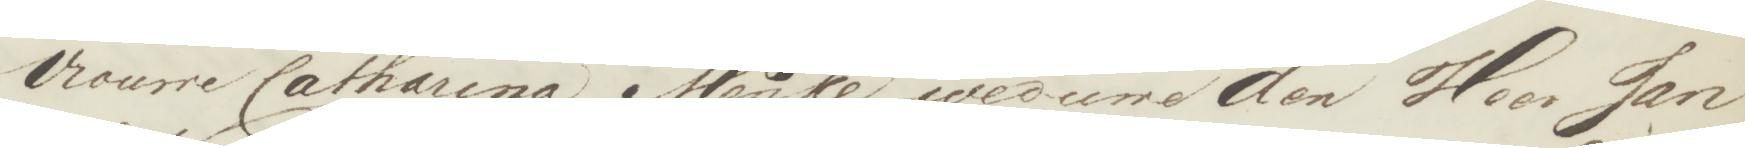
Vrouwe Catharina Menke weduwe den Heer Jan
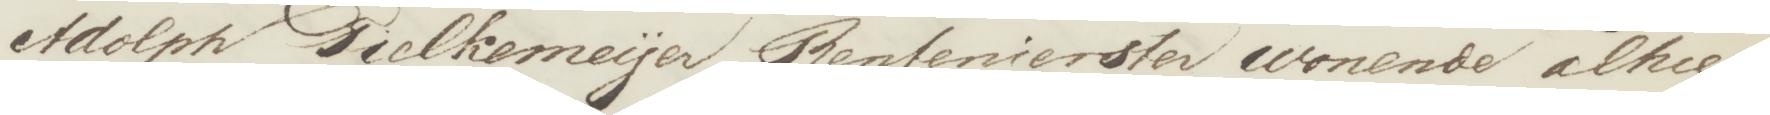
Adolph Tielkemeijer Rentenierster wonende alhier
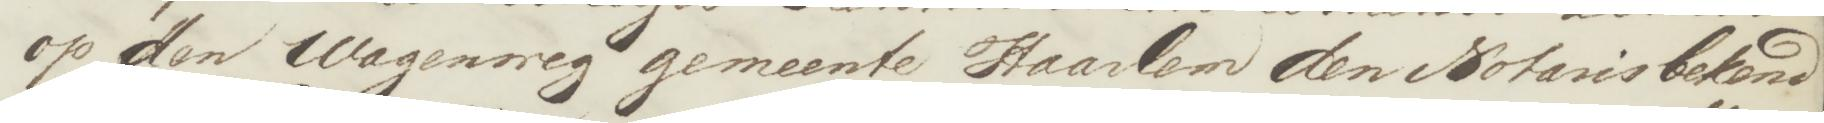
op den Wagenweg gemeente Haarlem den Notaris bekend
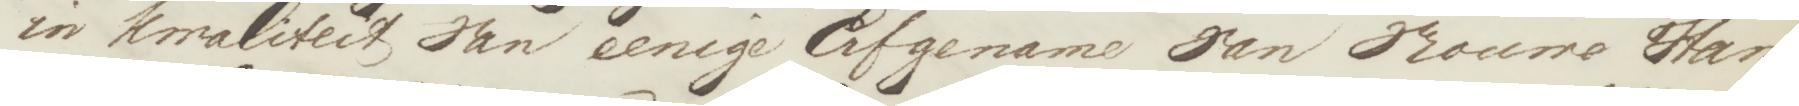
in kwaliteit van eenige Erfgename van Vrouwe Han
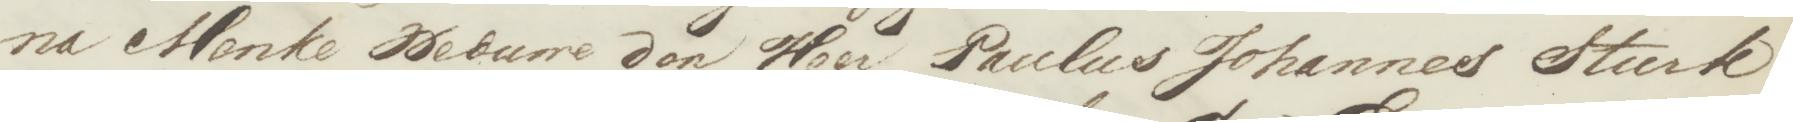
na Menke weduwe den Heer Paulus Johannes Sturk
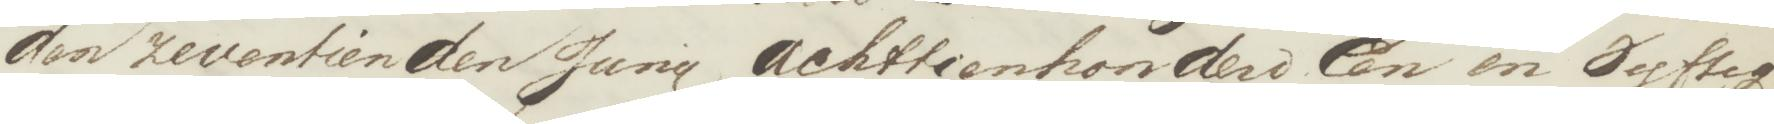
den zeventien den Junij achttienhonderd Een en Vyftig
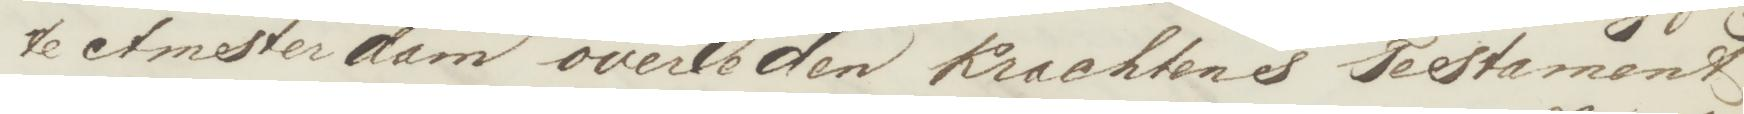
te Amsterdam overleden krachtens Testament
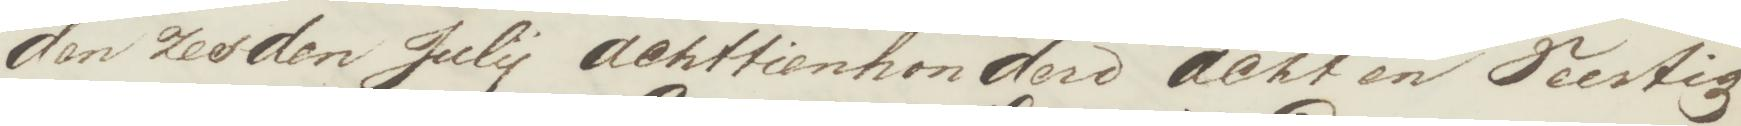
den zesden Julij achttienhonderd acht en Veertig
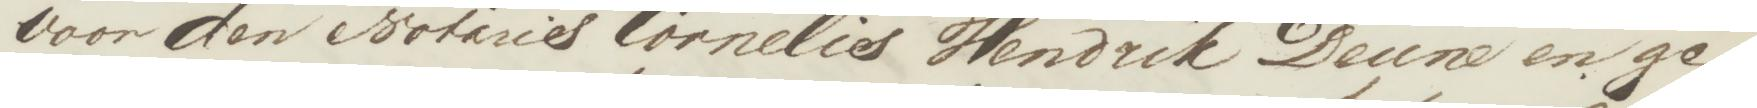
voor den Notaris Cornelis Hendrik Deune en ge
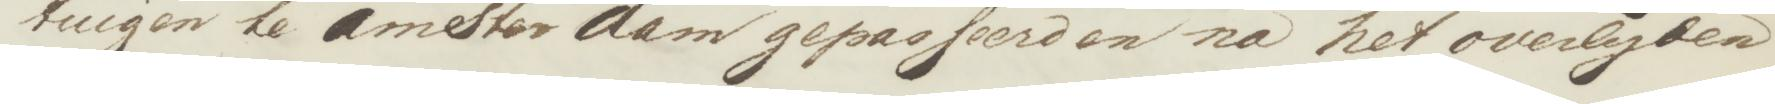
tuigen te amsterdam gepasseerd en na het overlyden
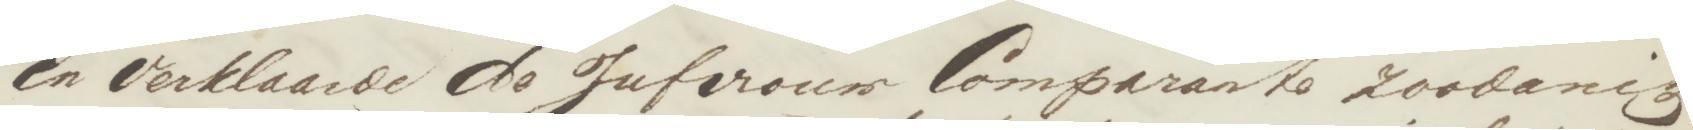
En verklaarde de Jufvrouw Comparante zoodanig
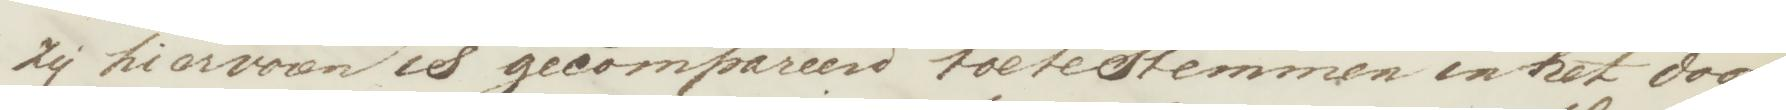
zij hiervoor is gecompareerd toetestemmen in het door
